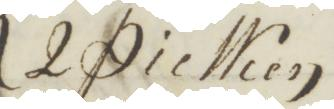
2 Piekken
